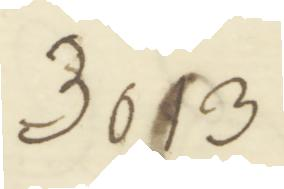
3013
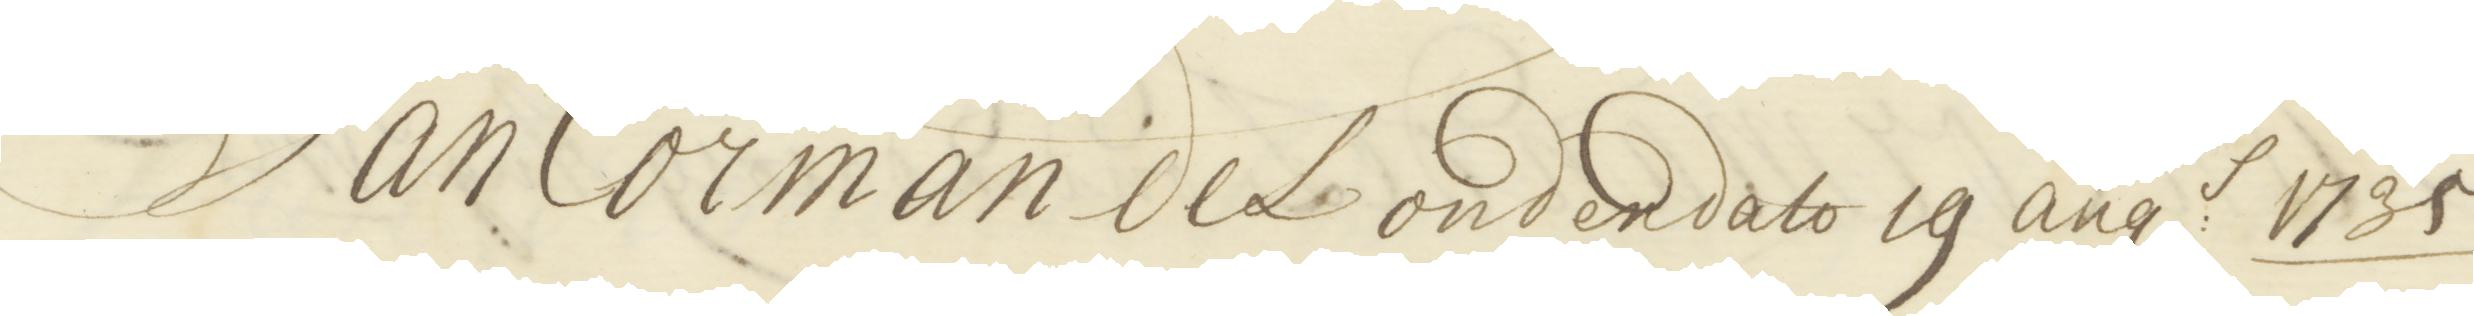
Van Cormandel onder dato 19 aug:s 1735
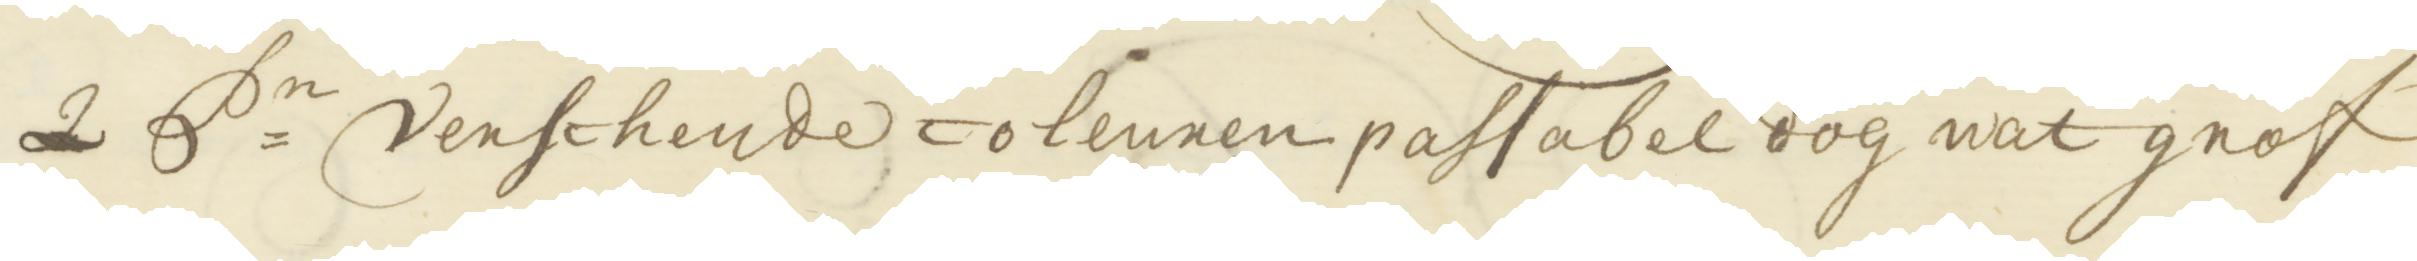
2 P=n verscheyde coleuren passabel dog wat grof
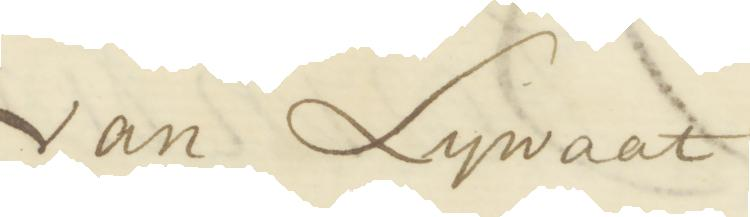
Van Lywaat
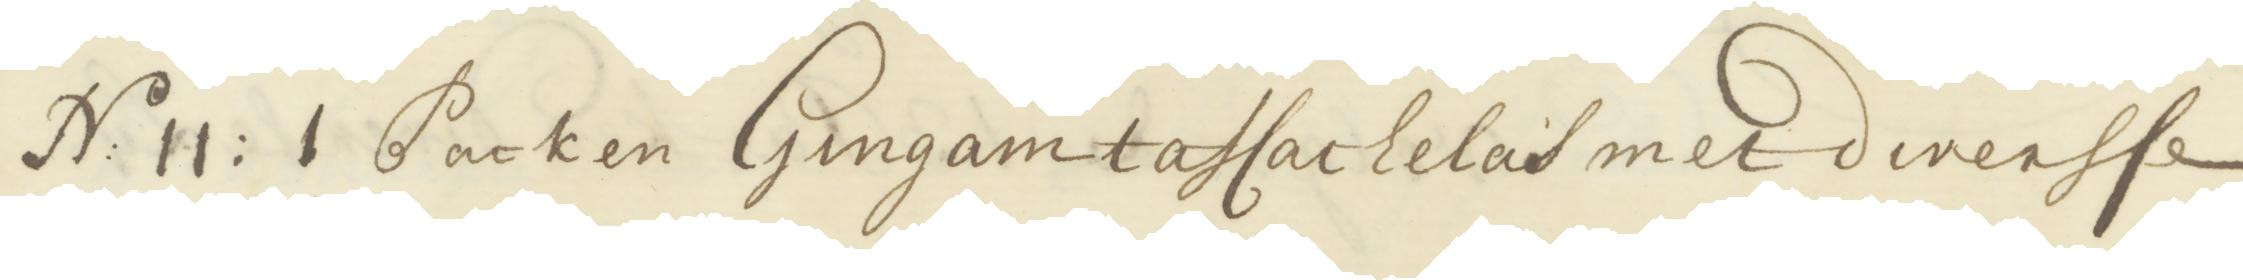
N: 11: 1 Packen Gingam taffachelas met diversse
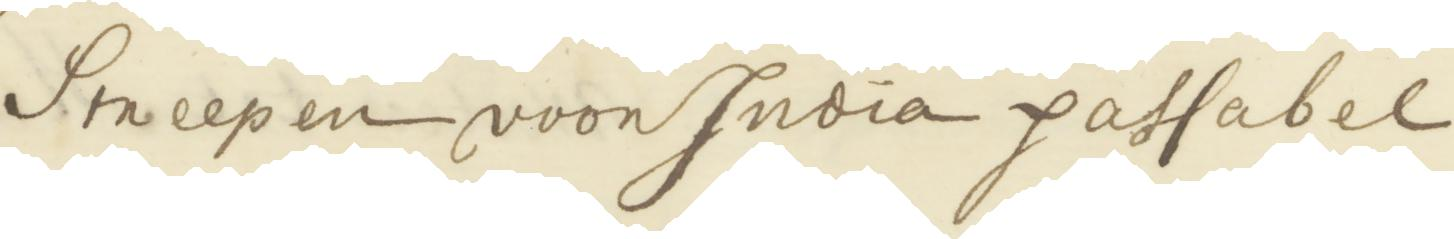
Streepen voor Jndia passabel
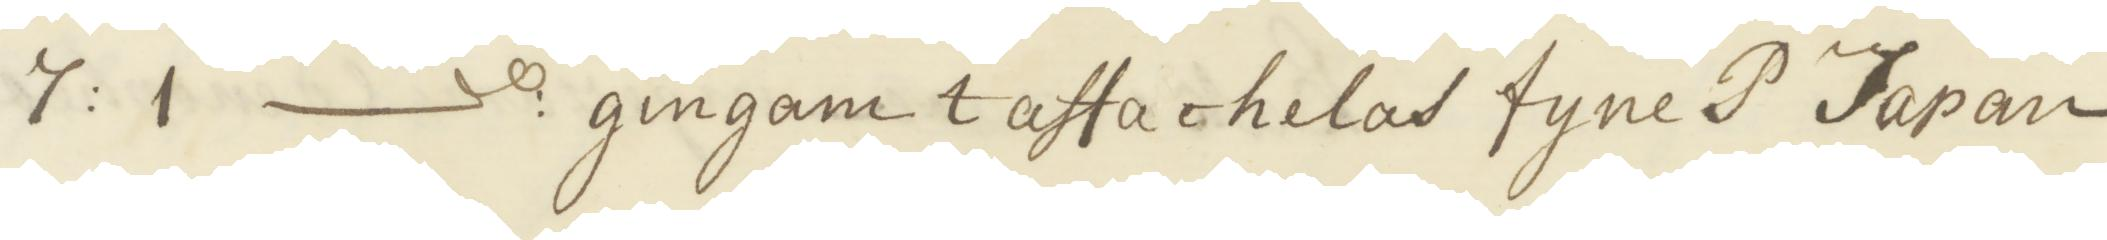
7: 1 —:o gingam taffachelas fyne P Iapan
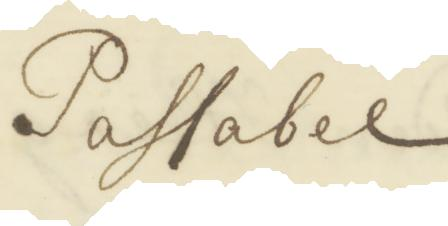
Passabel
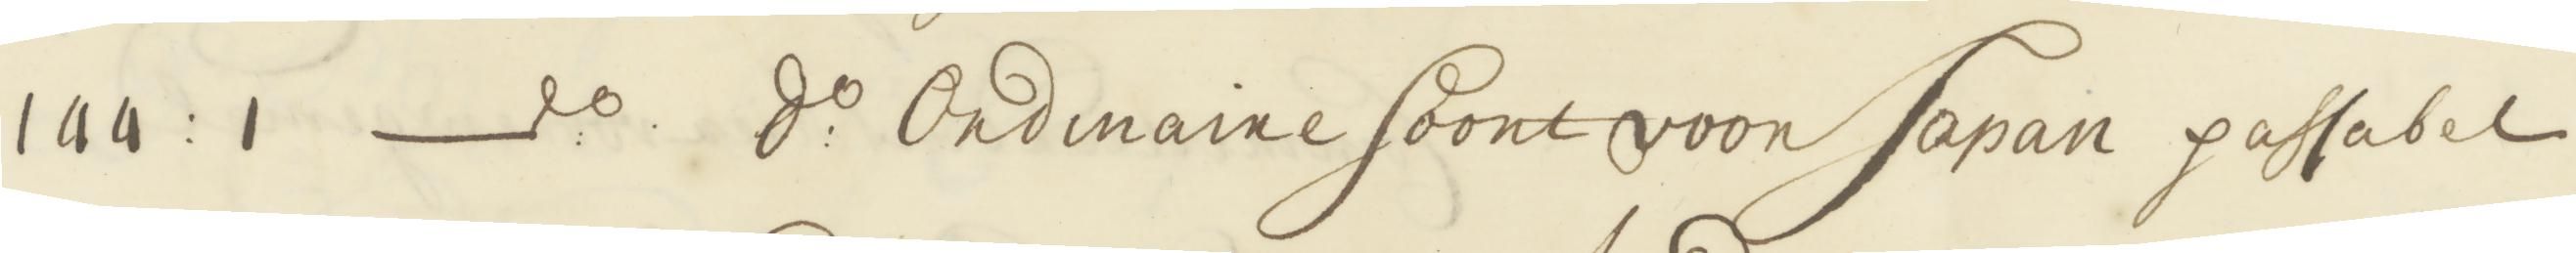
144: 1 —:o d:o Ordinaire Soort voor Japan passabel
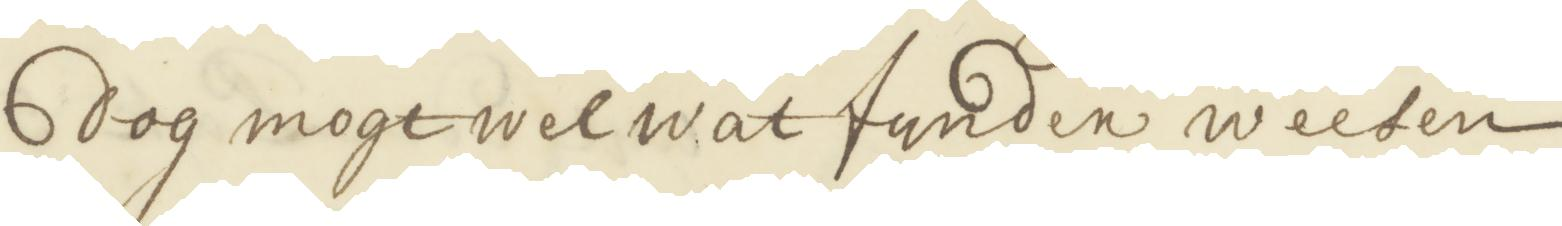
dog mogt wel wat fynder weesen
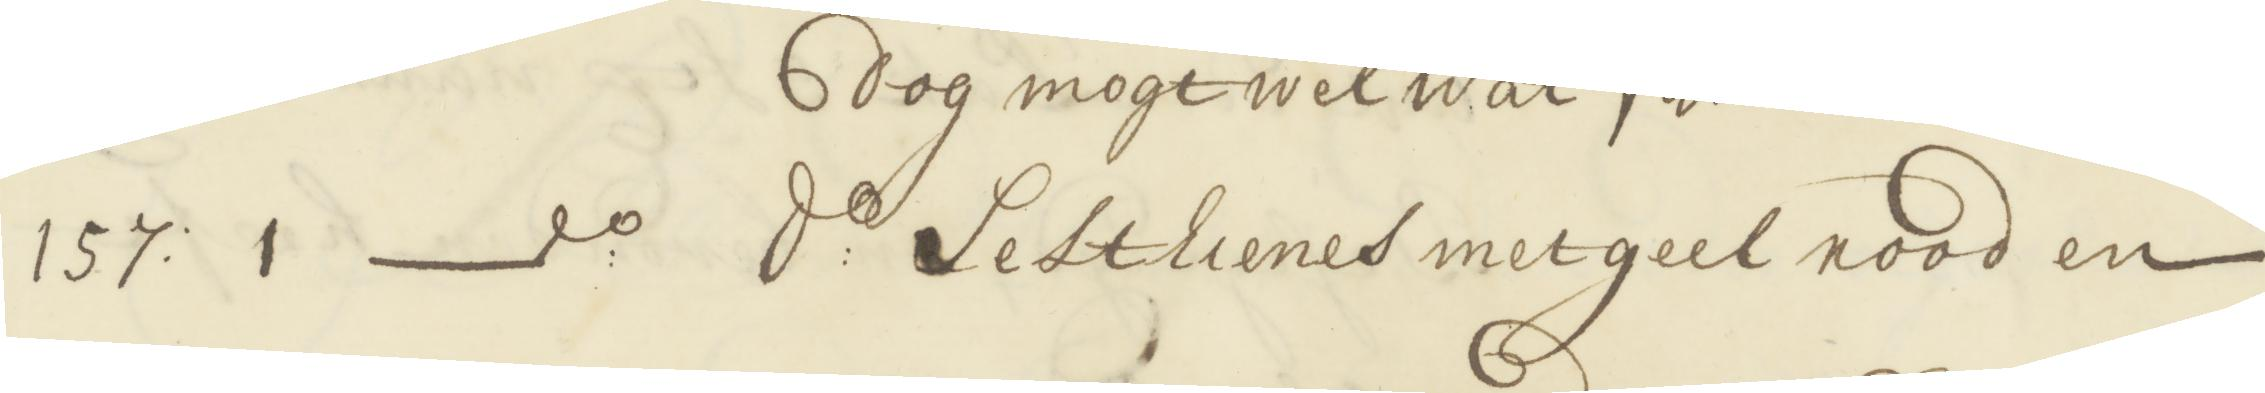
157: 1 —:o d:o Sesthienes met geel rood en
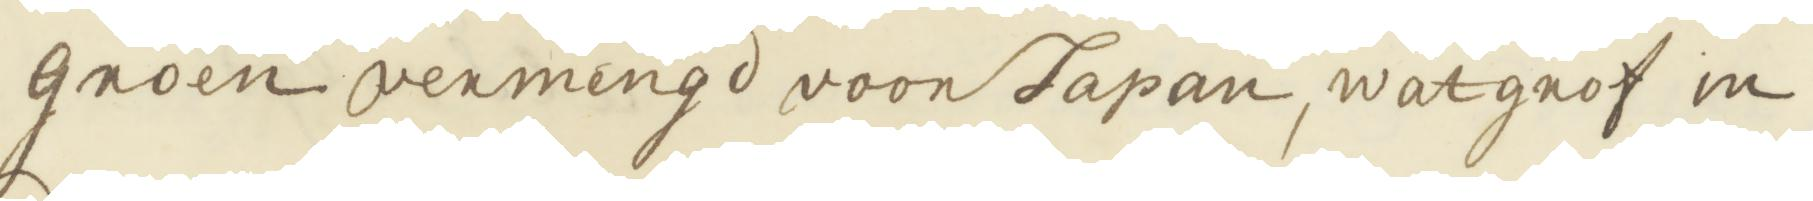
groen vermengd voor Iapan, wat grof in
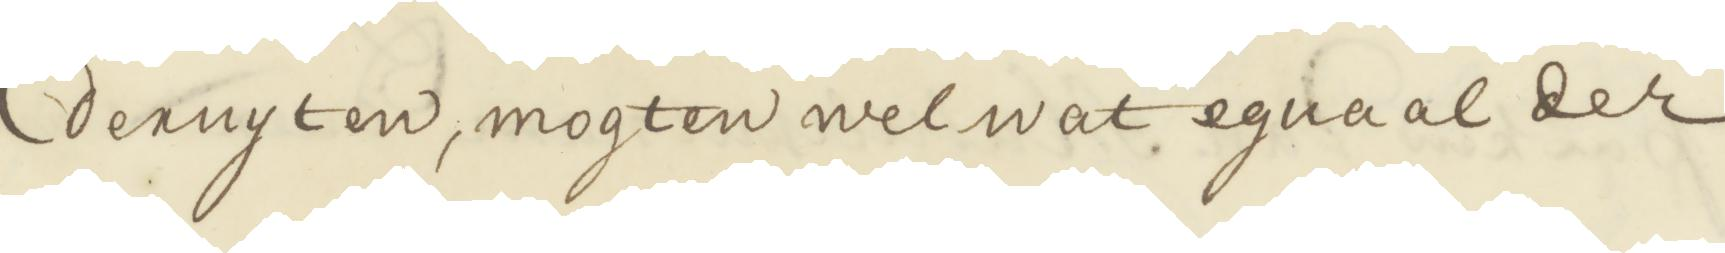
de ruyten, mogten wel wat eguaalder
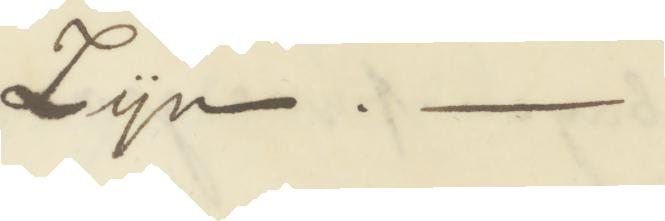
Zijn. —
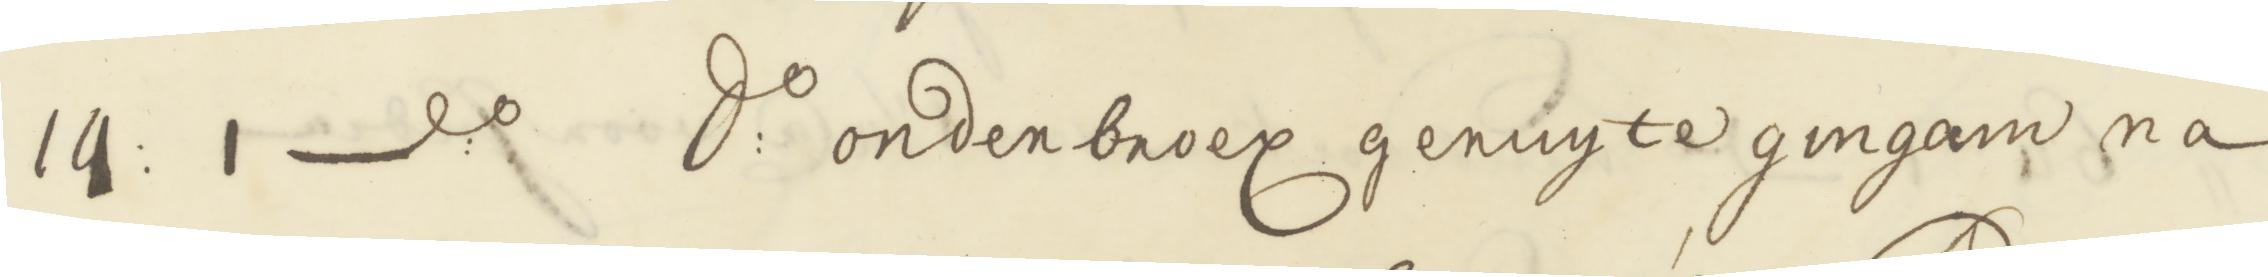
14: 1 —:o d:o onderbroex geruyte gingam na
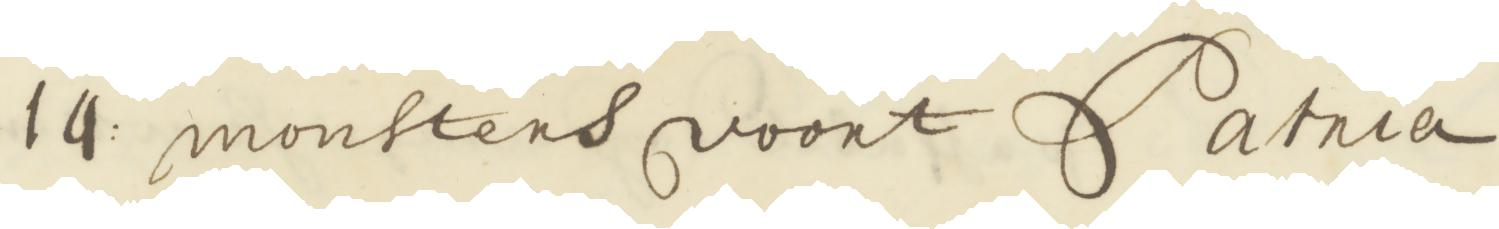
14: monsters voor't Patria
